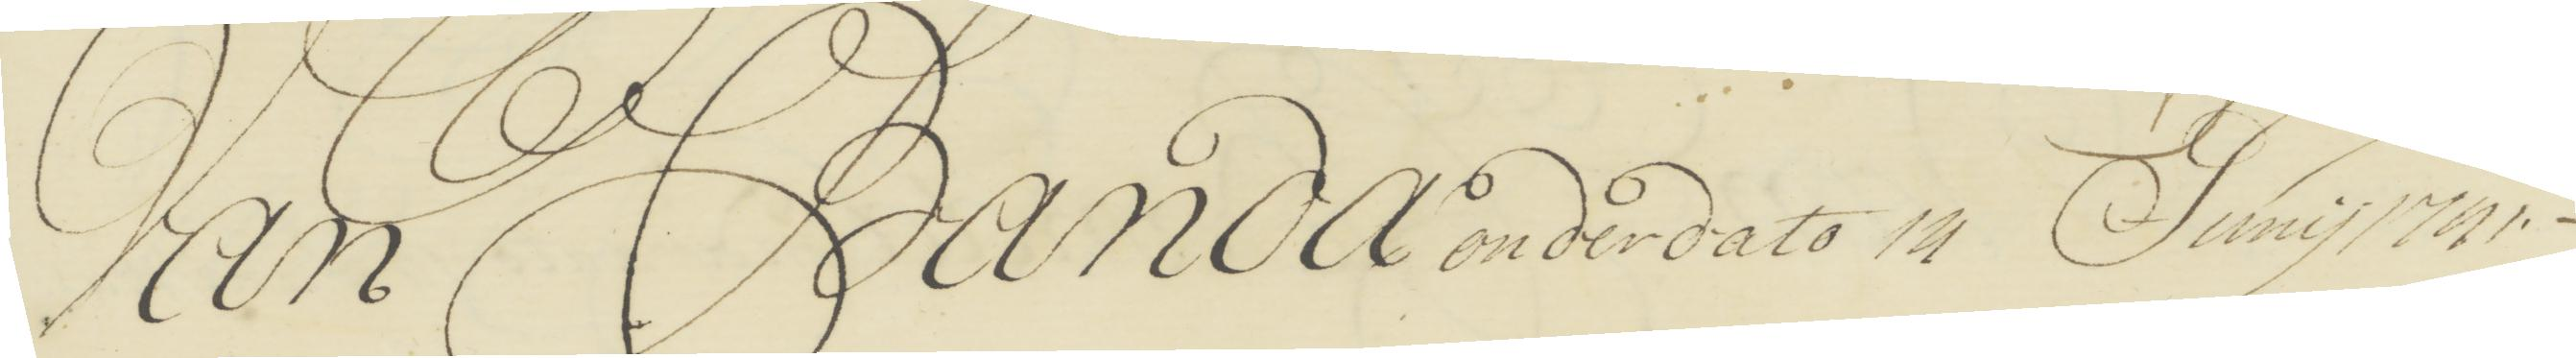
Van Banda onder dato 14 Junij 1741.—
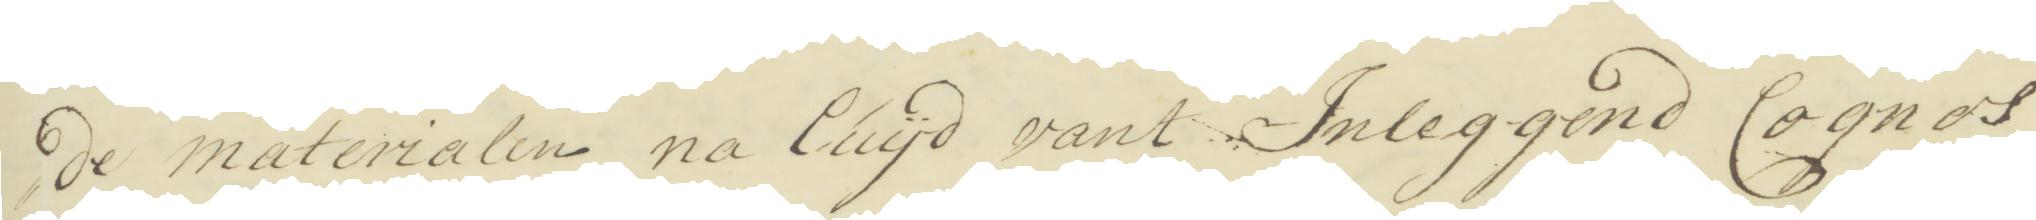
de materialen na luijd vant Inleggend Cognos
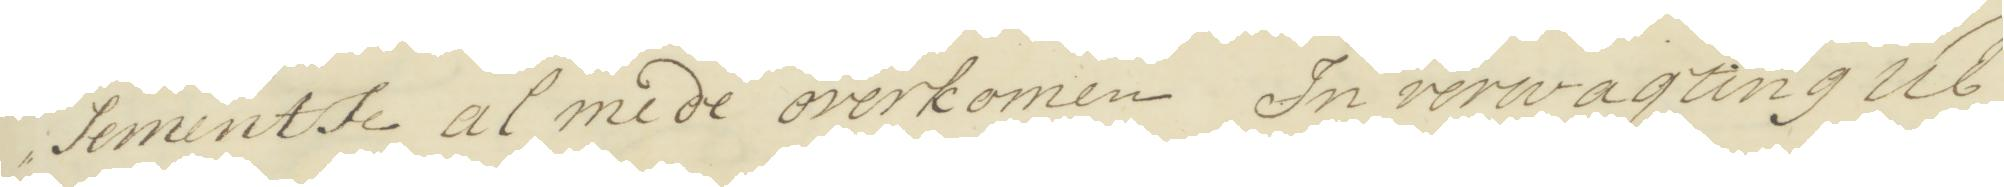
„sementse al mede overkomen Jn verwagting uE
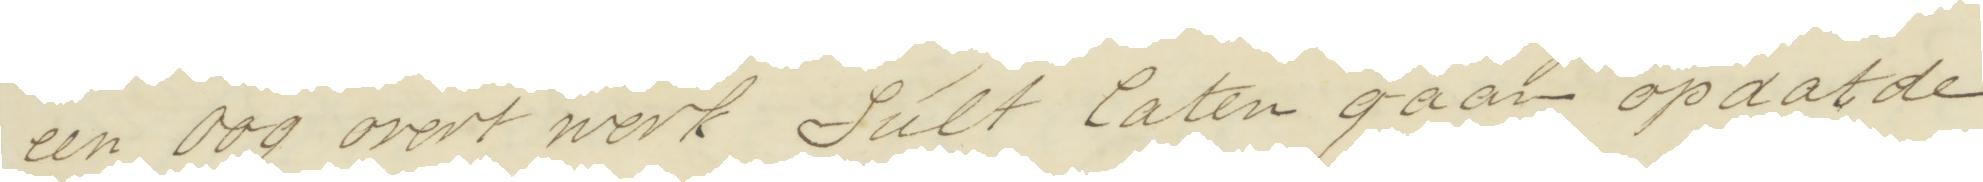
een oog overt werk sult laten gaan op dat de
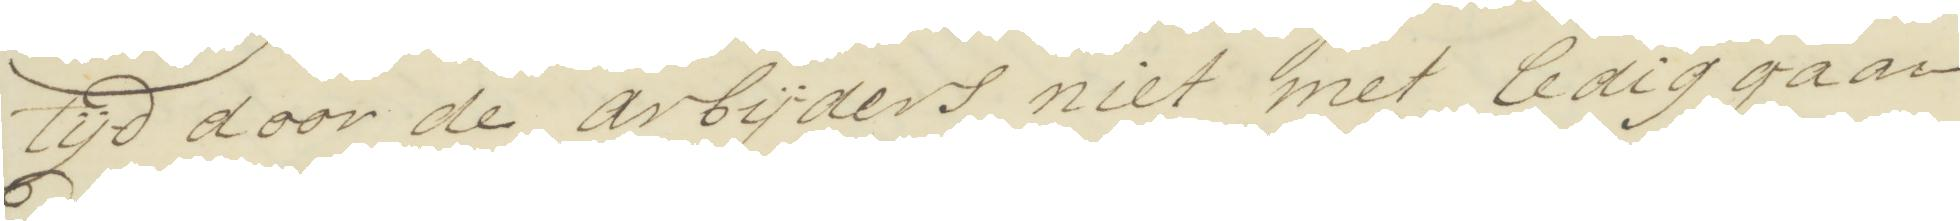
tijd door de arbijders niet met ledig gaan
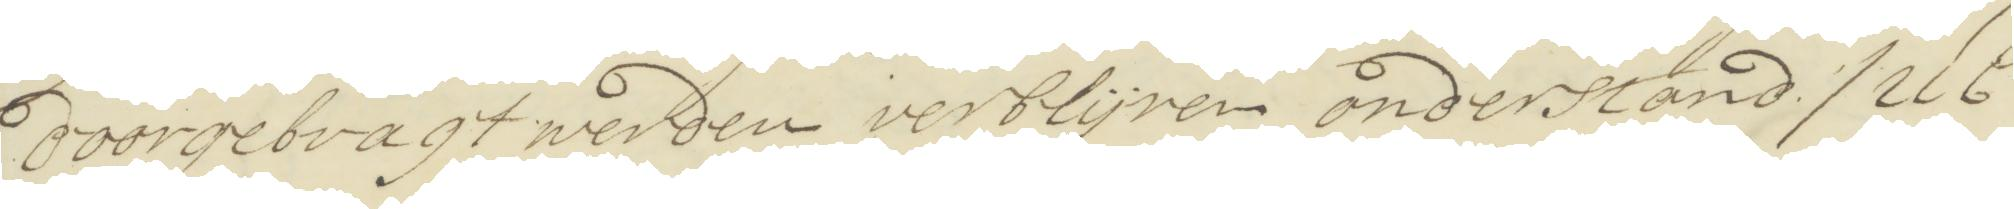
doorgebragt werden verblijven onderstond :/ uE
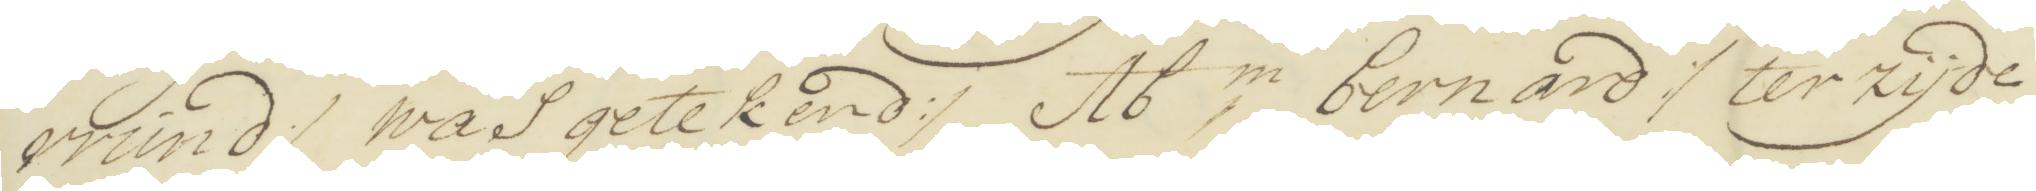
vrund :/ was getekend:/ Ab„m bernard :/ ter zijde
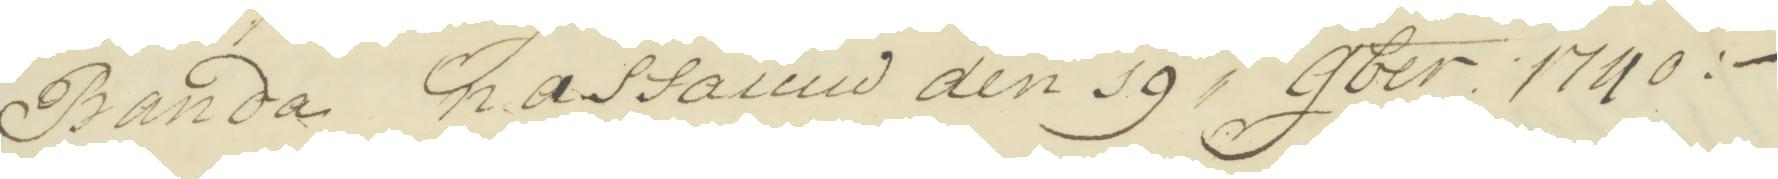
Banda nassauw den 19„e 9ber: 1740 :-
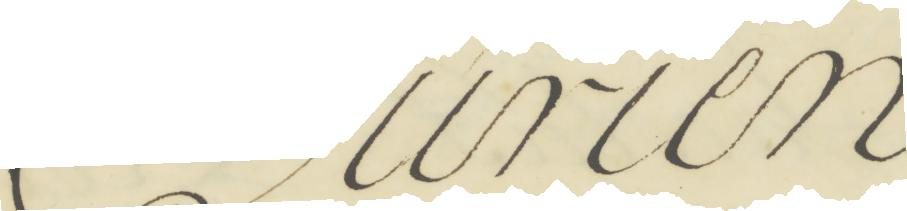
Ourien
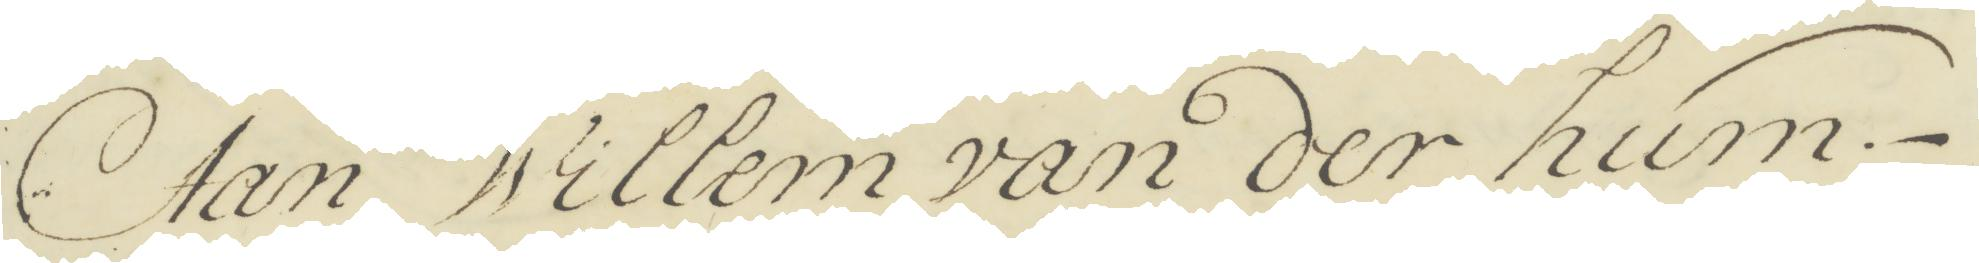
Aan Willem van der hum.—
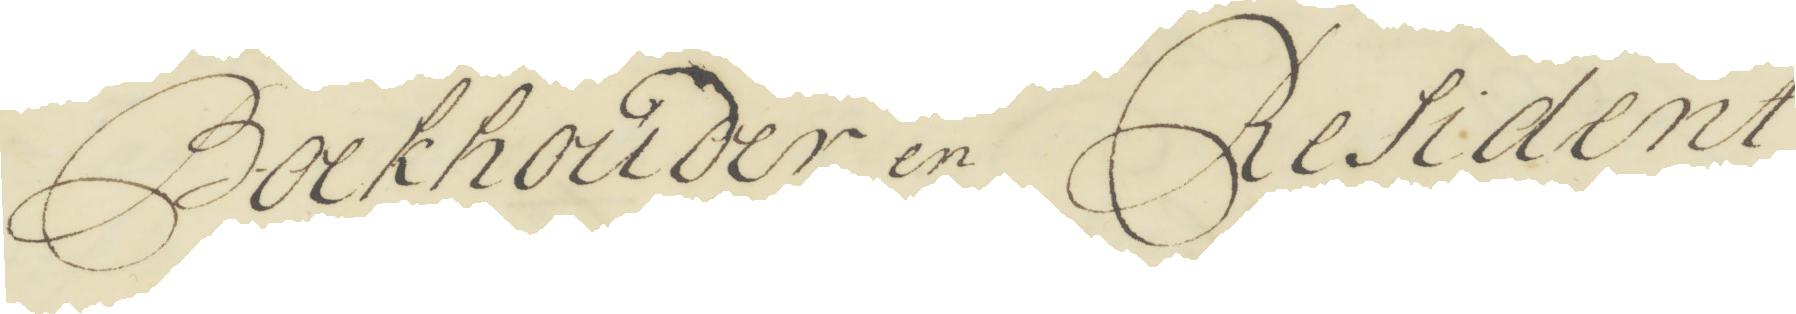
Boekhouder en Resident
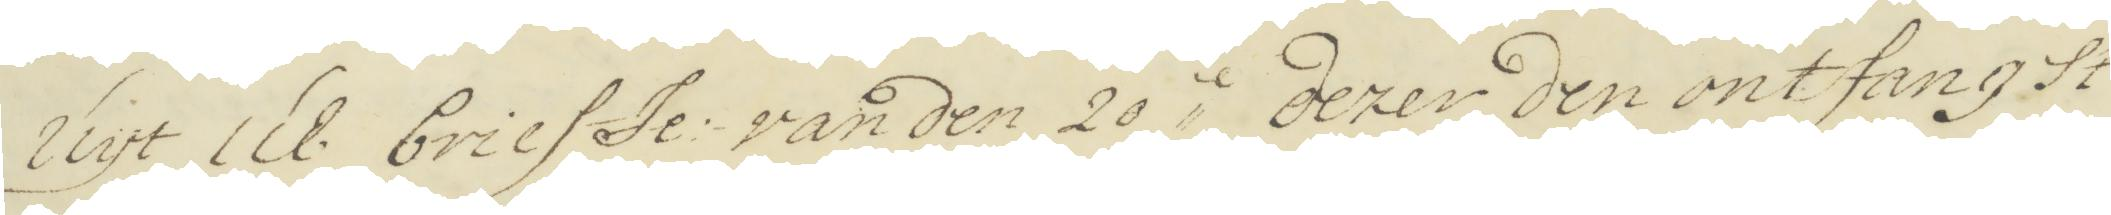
uijt uE briefie: van den 20„e dezer den ontfangst
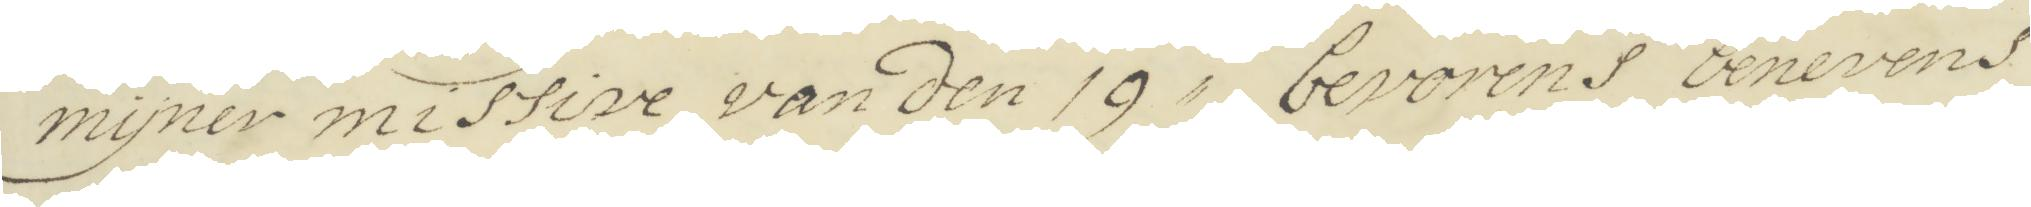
mijner missive van den 19„e bevorens benevens
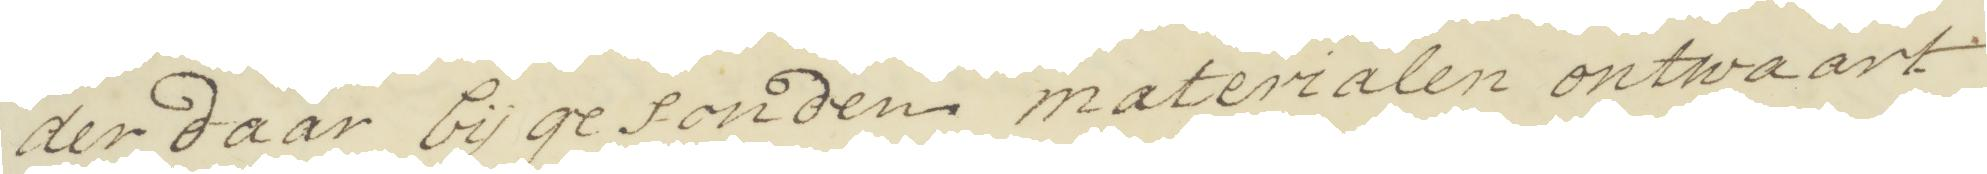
der daar bij gesonden materialen ontwaart
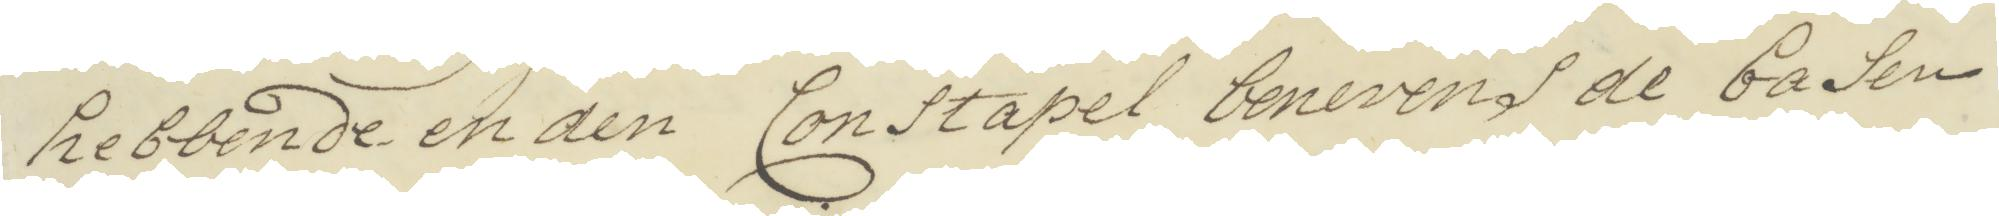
hebbende en den Constapel benevens de basen
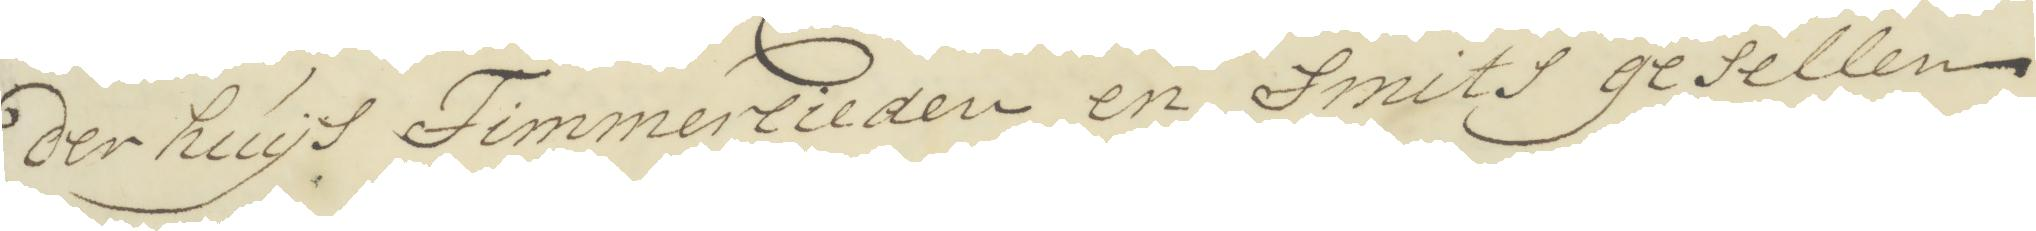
der huijs Timmerlieden en smits gesellen
